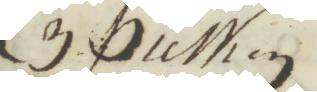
3 Piekken
